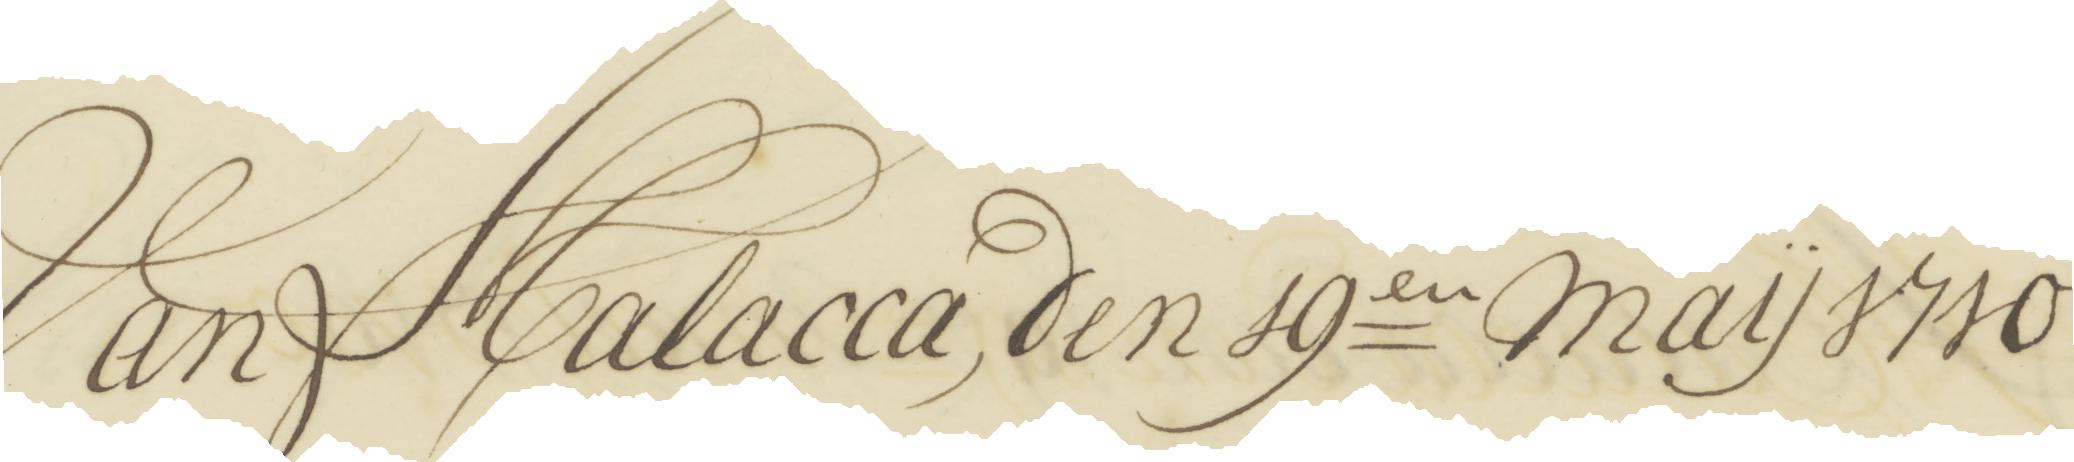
Van Malacca, den 19=en maij 1710
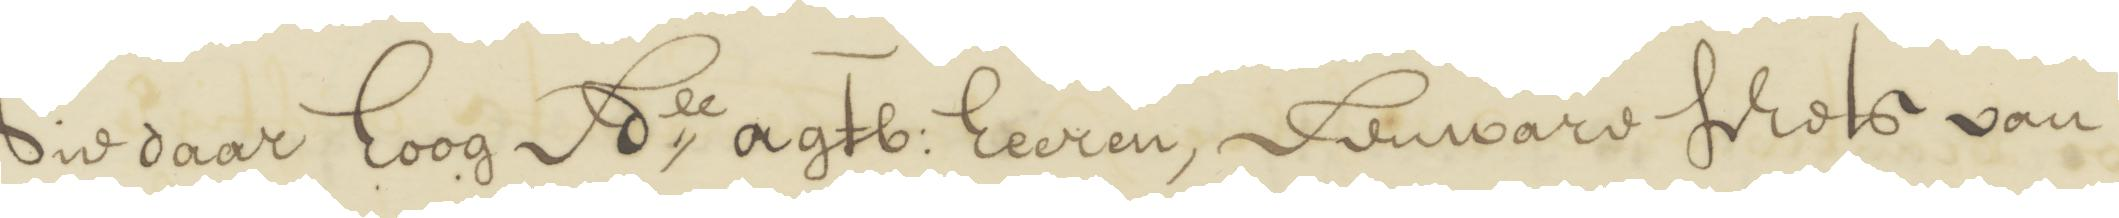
Sie daar hoog Ed„le agtb: heeren, Een ware schets van
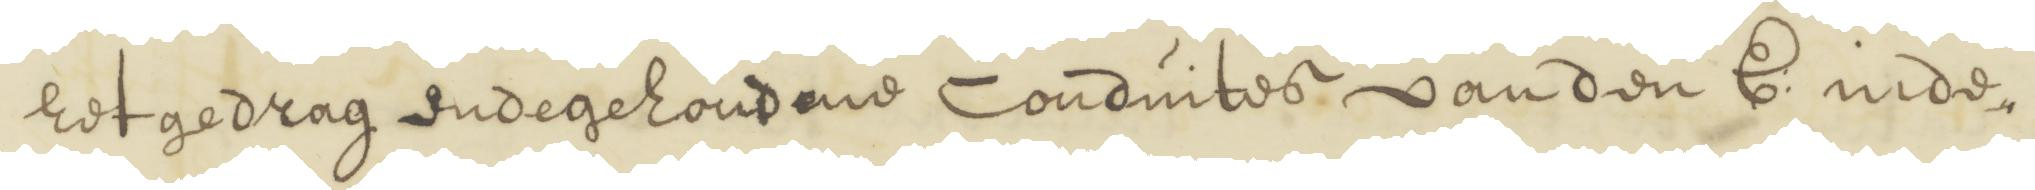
het gedrag ende gehoudene conduites van den E: inde„
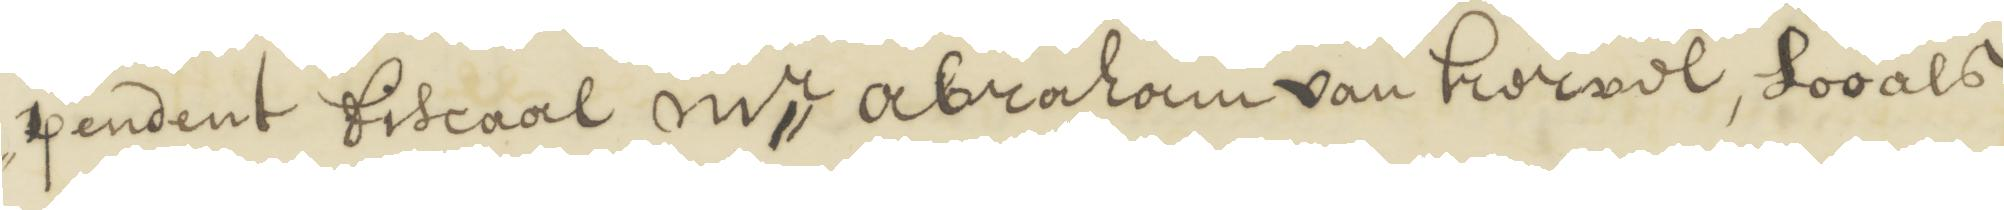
pendent fiscaal m„r abraham van kervel, sooals
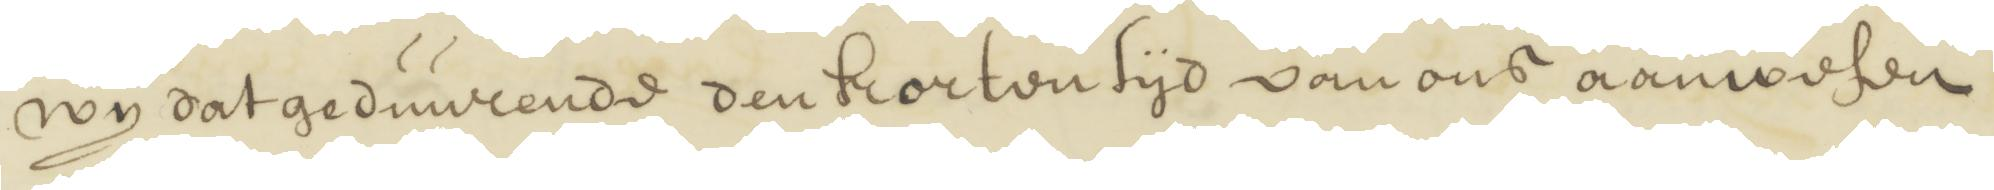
wij dat geduurende den korten tijd van ons aanwesen
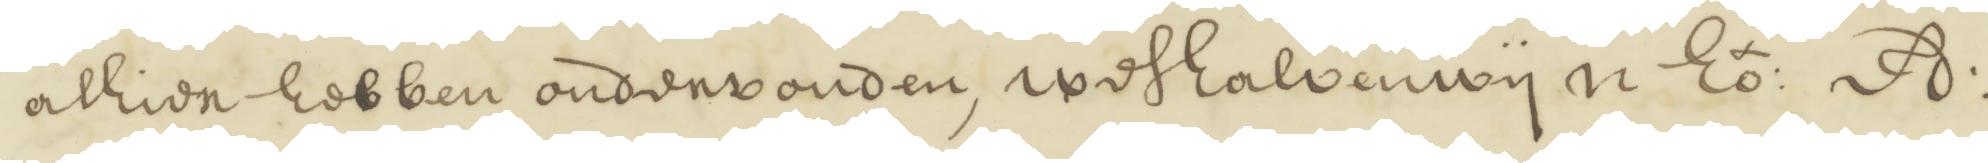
alhier hebben ondervonden, weshalven wij u ho: Ed
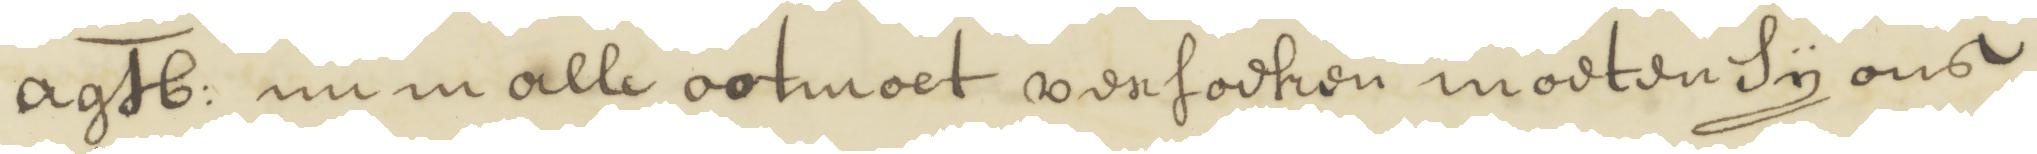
agtb: nu in alle ootmoet versoeken moeten sij ons
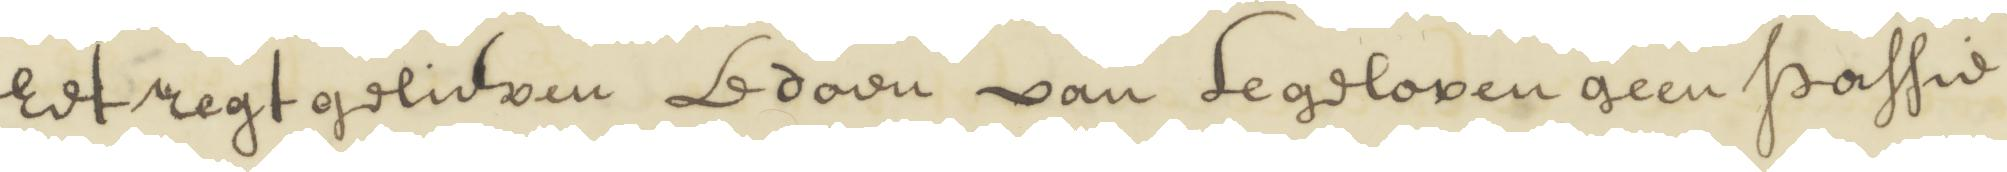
het regt gelieven te doen van te geloven geen passie
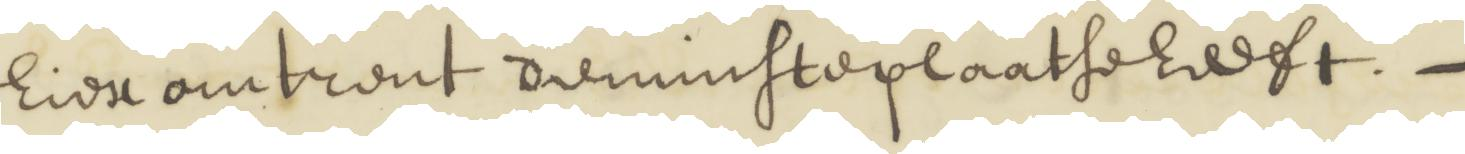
hier omtrent de minste plaatse heeft. —
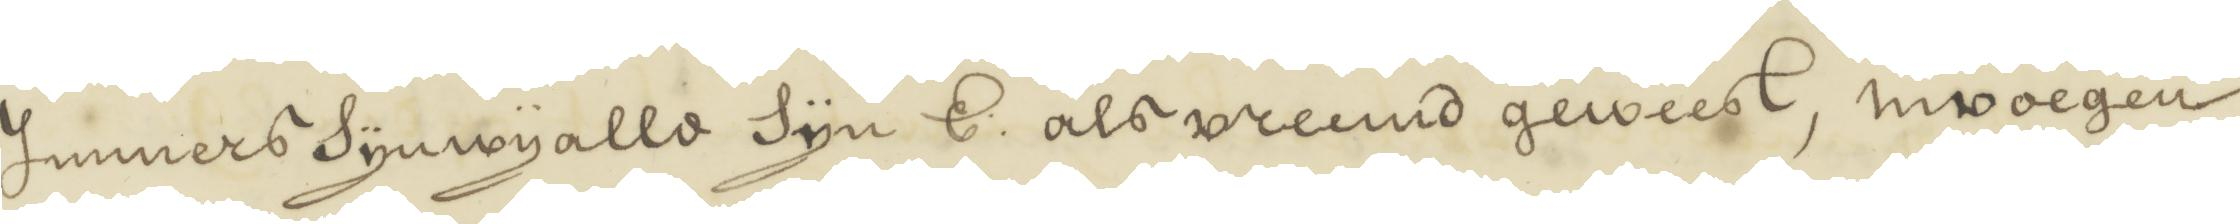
Jmmers sijn wij alle sijn E: als vreemd geweest, in voegen
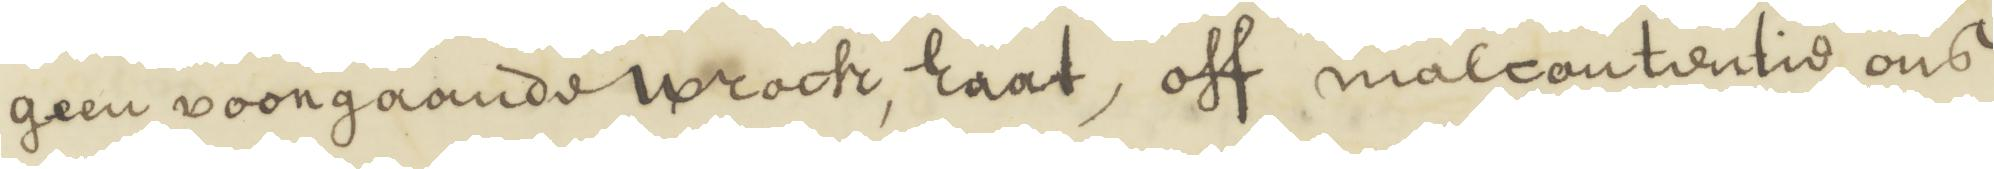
geen voorgaande wrock, haat, off malcontentie, ons
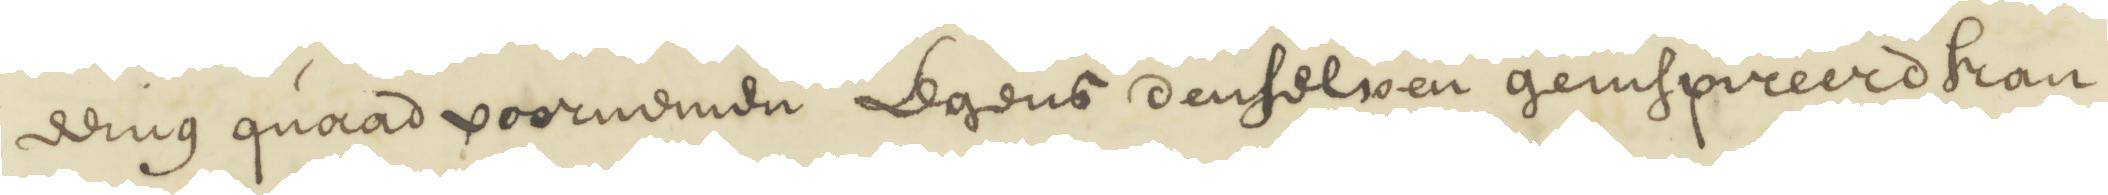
eenig quaad voornemen tegens denselven geinspireerd kan
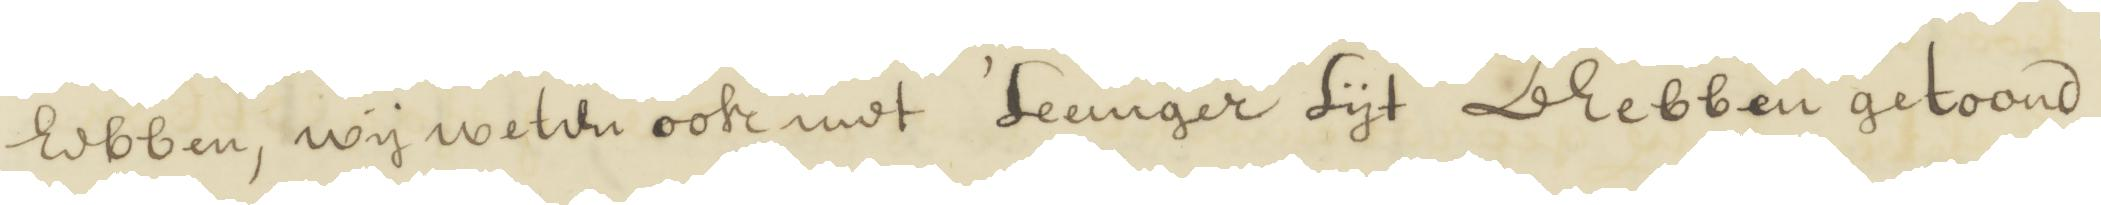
hebben, wij weten ook met 't eeniger tijt te hebben getoond,
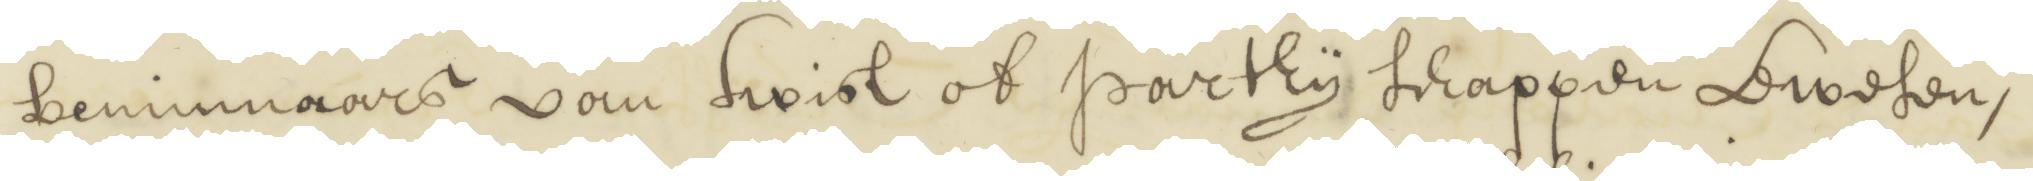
beminnaars van twist of parthij schappen te wesen,
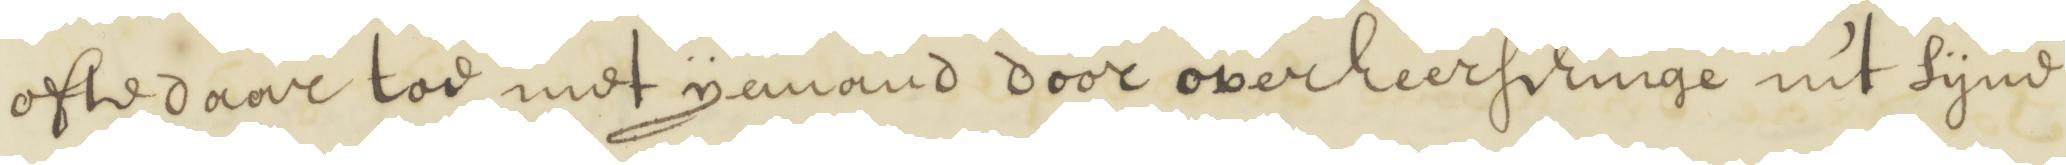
ofte daar toe met ijemand door overheerschinge in 't sijne
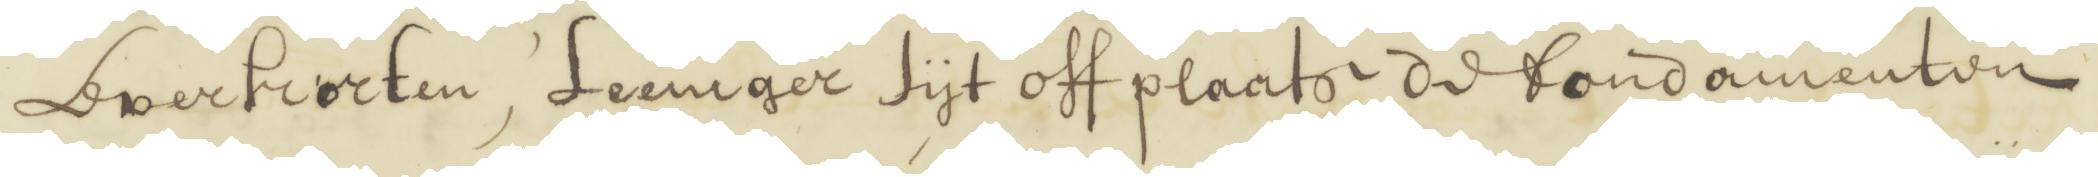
te verkorten, 't eeniger tijt off plaats de fondamenten
